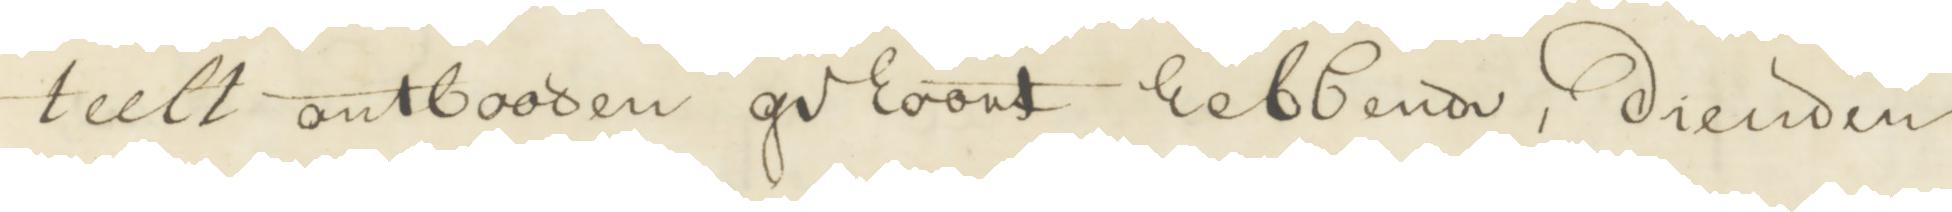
teelt ontbooden gehoort hebbende, dienden
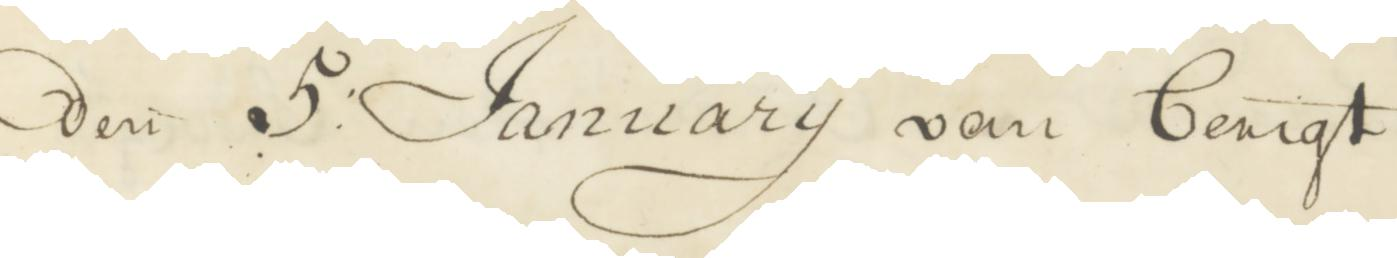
den 5: Ianuarij van berigt
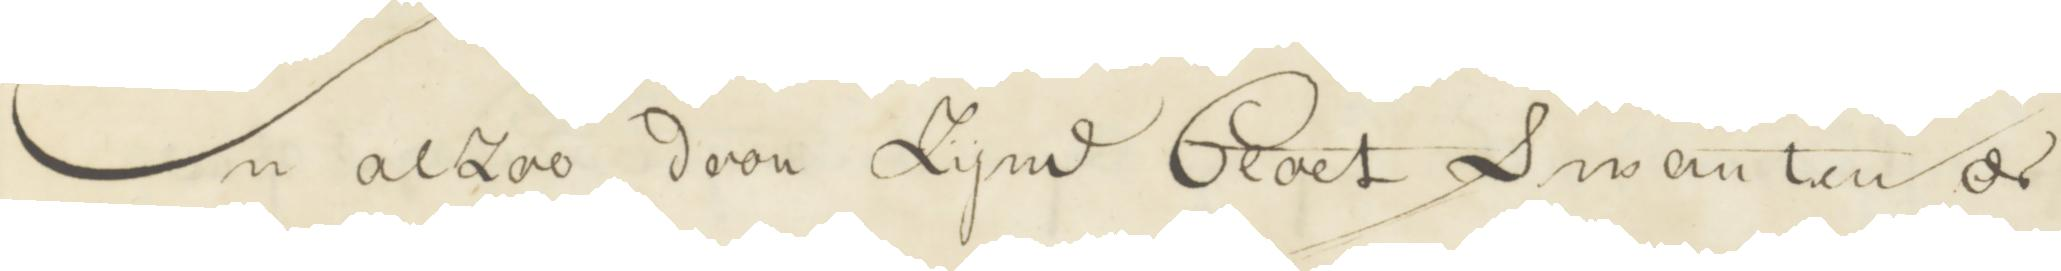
En alzoo door zijne bloet verwanten de
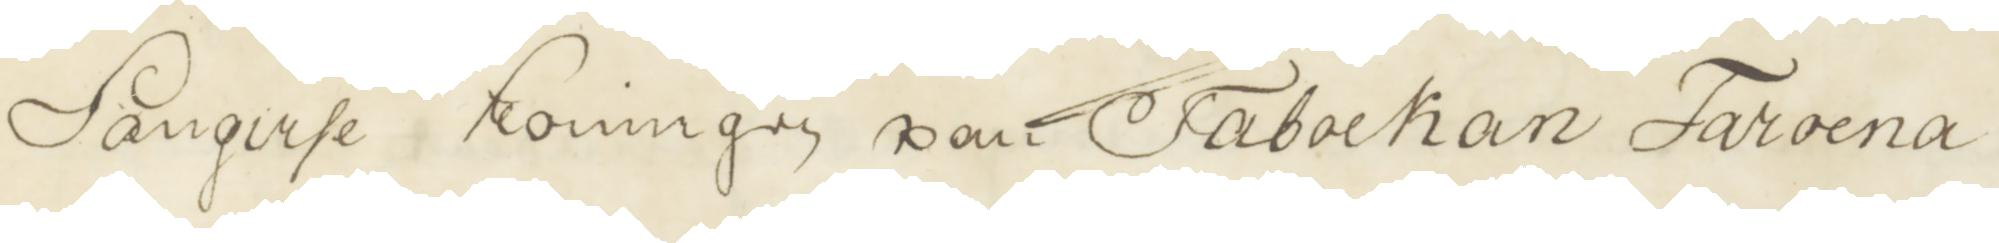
Sangirse koningen van Taboekan Taroena
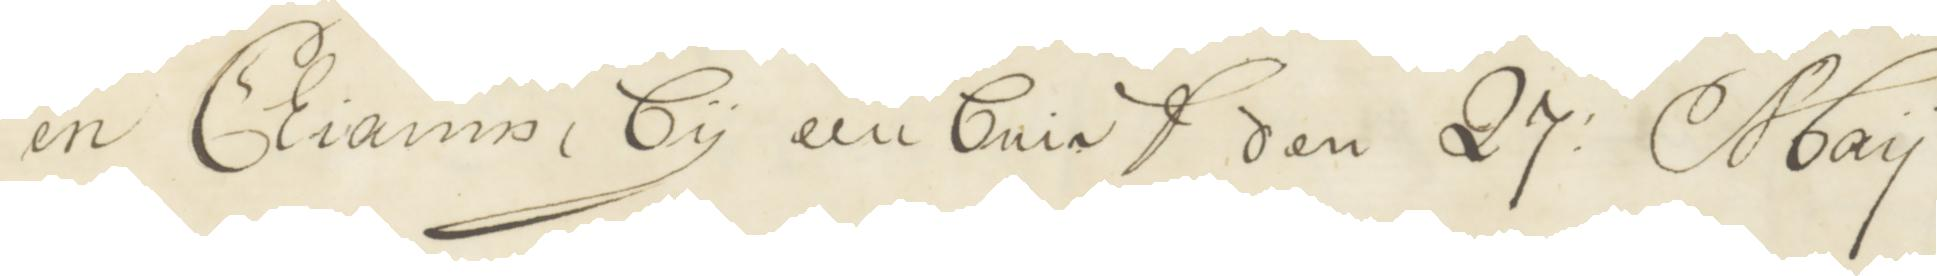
en Chiauw, bij een brief den 27:' Maij
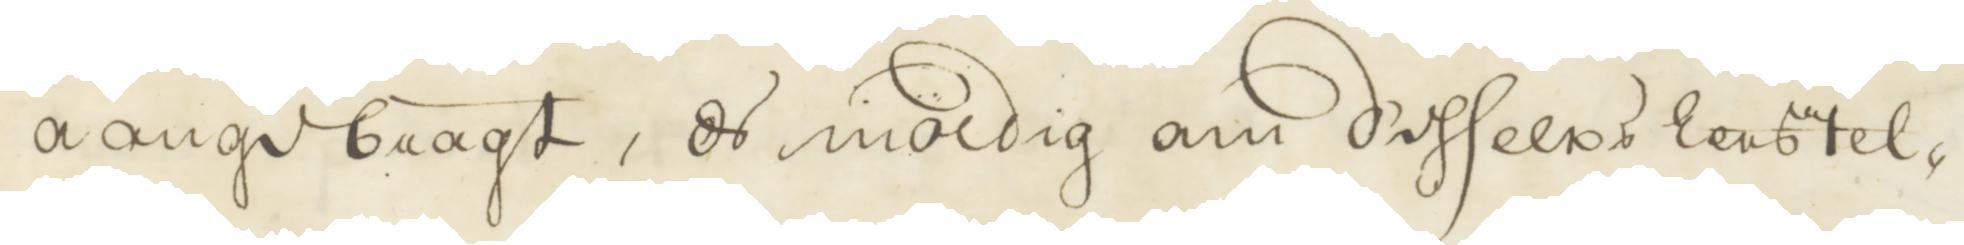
aangebragt, de moedig om desselvs herstel„
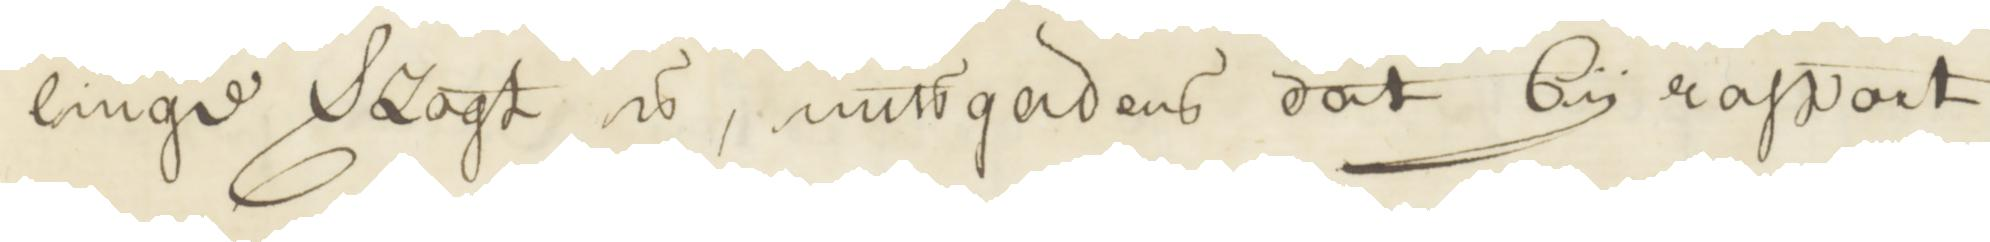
linge verzogt is, mitsgaders dat bij rapport
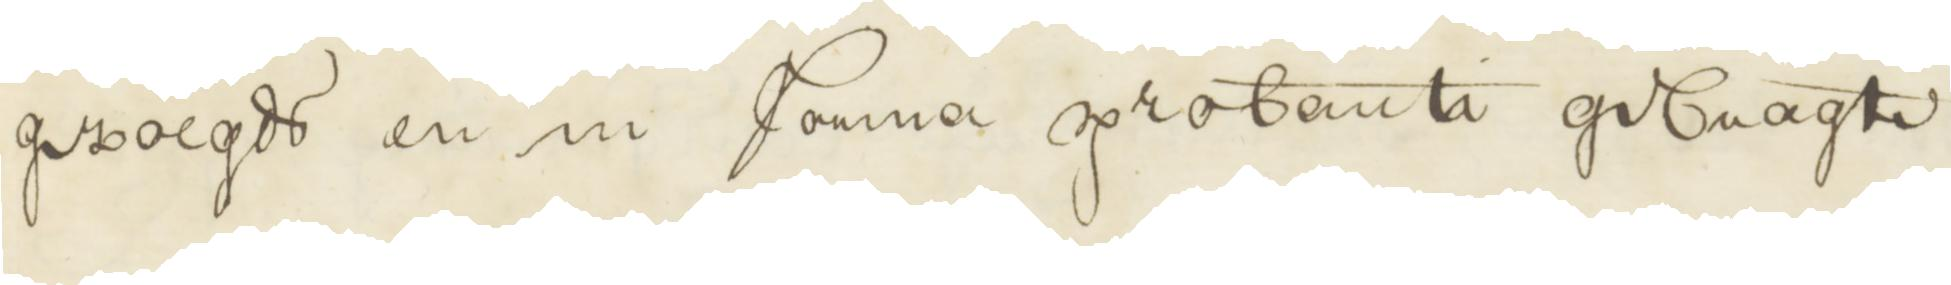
gevoegds en in forma probanti gebragte
